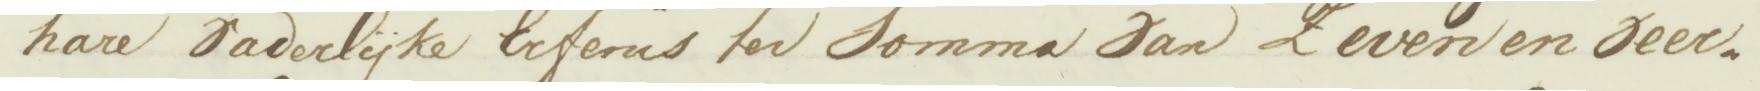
hare vaderlijke Erfenis ter somma van Zeven en veer„
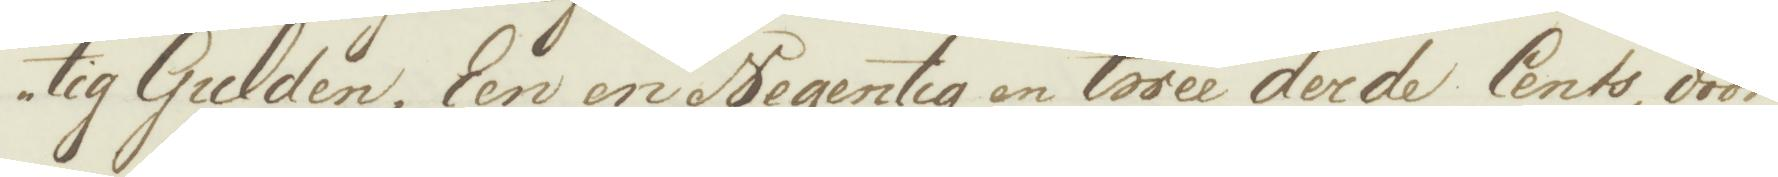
„tig Gulden, Een en Negentig en twee derde Cents, door
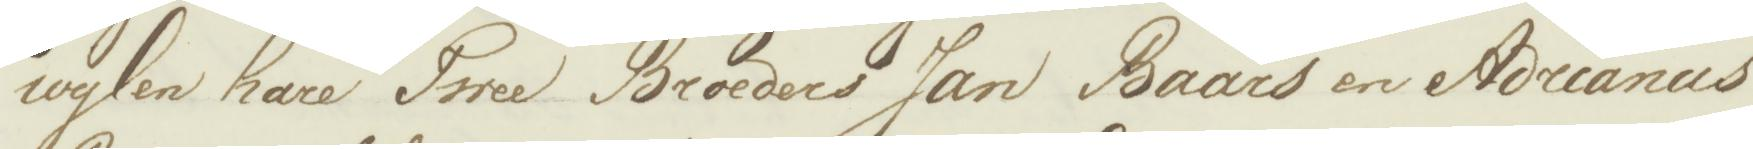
wylen hare Twee Broeders Jan Baars en Adrianus
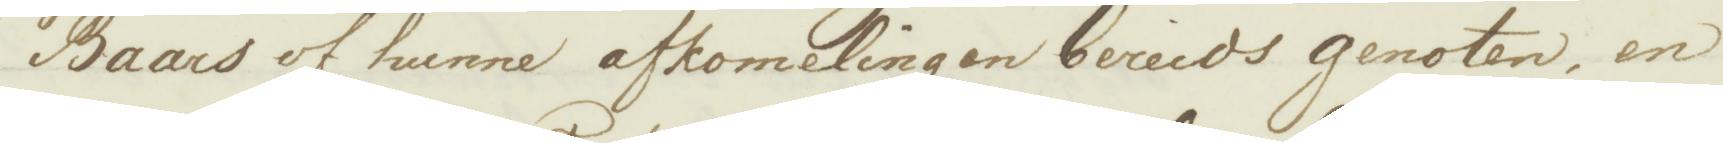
Baars of hunne afkomelingen bereids genoten, en
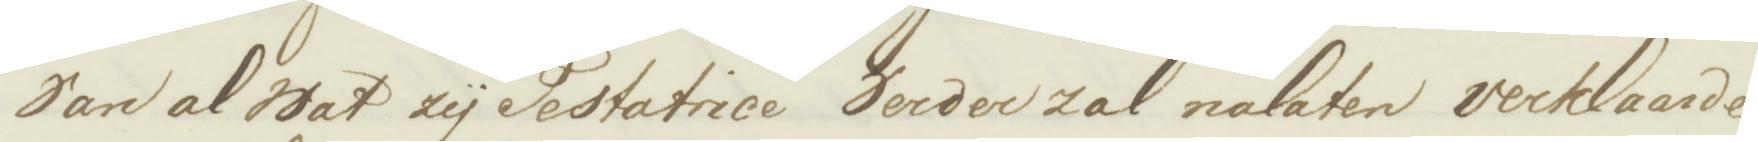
van al wat zij Testatrice verder zal nalaten verklaarde
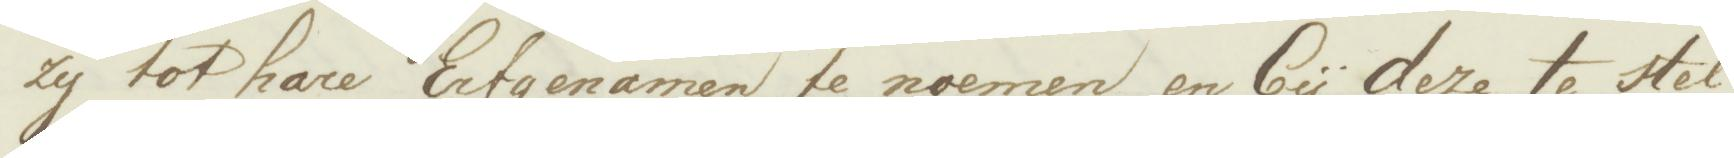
zij tot hare Erfgenamen te noemen en bij deze te stel
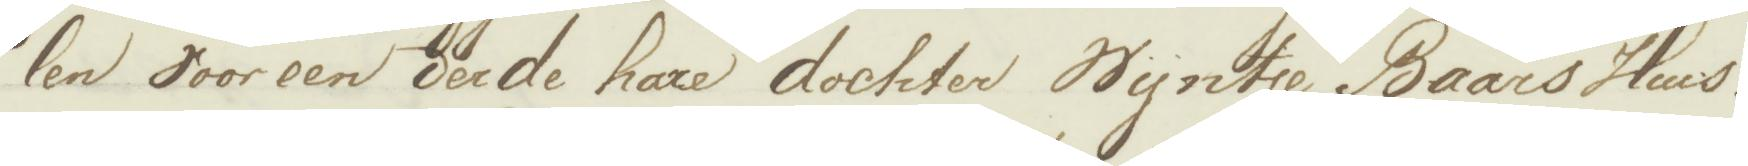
len voor een derde hare dochter Wijntje Baars Huis
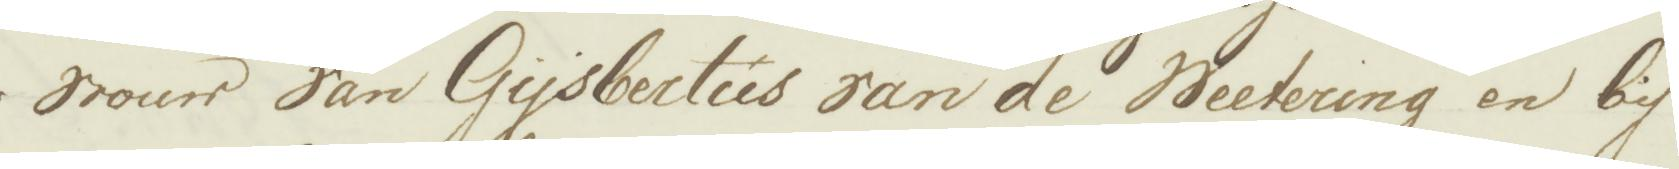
Vrouw van Gijsbertus van de Weetering en bij
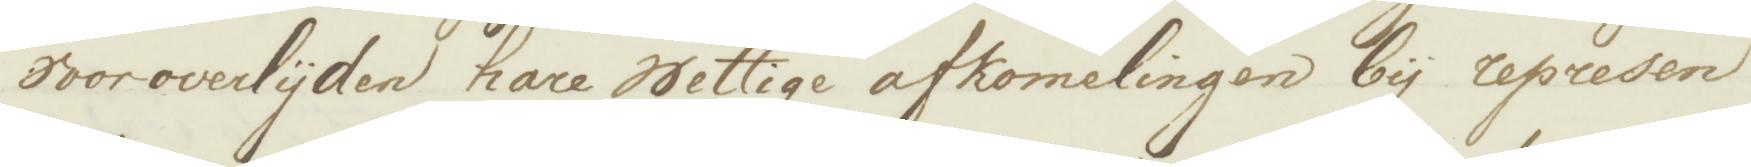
vooroverlijden hare wettige afkomelingen bij represen
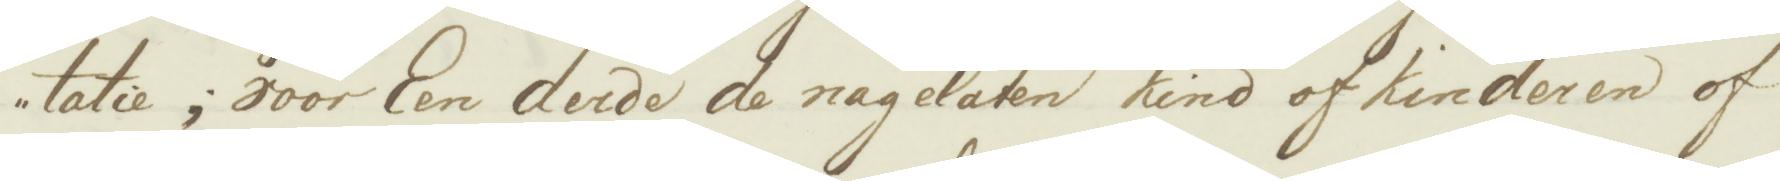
„tatie; voor Een derde de nagelaten kind of kinderen of
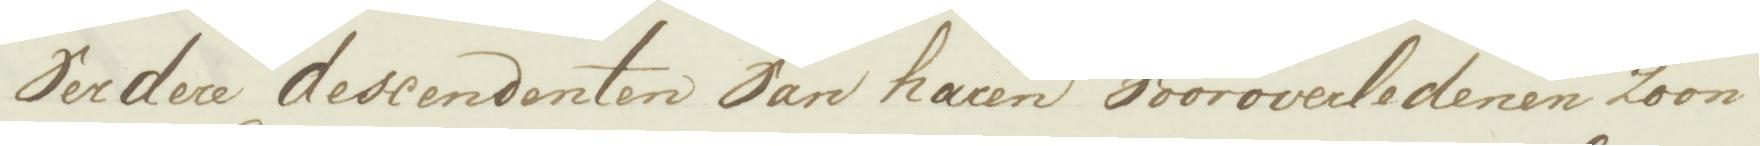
verdere descendenten van haren vooroverledenen zoon
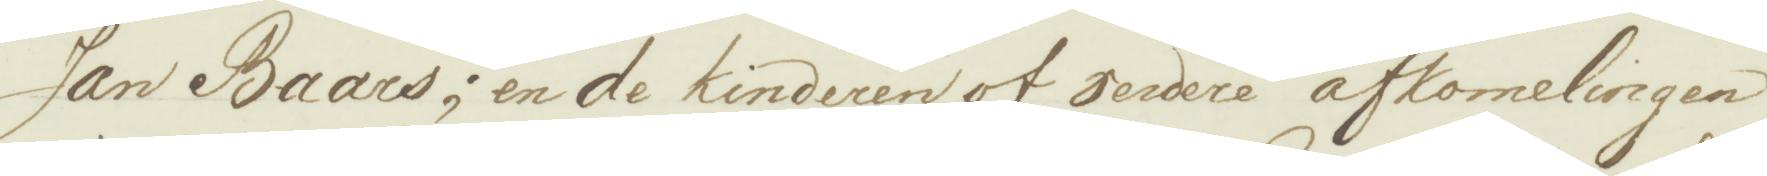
Jan Baars; en de kinderen of verdere afkomelingen
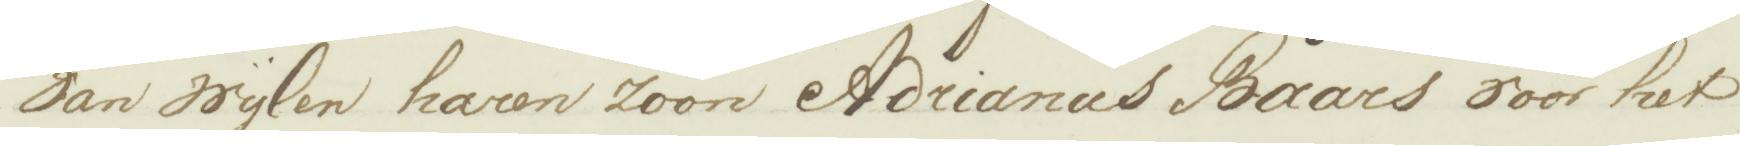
van wijlen haren zoon Adrianus Baars voor het
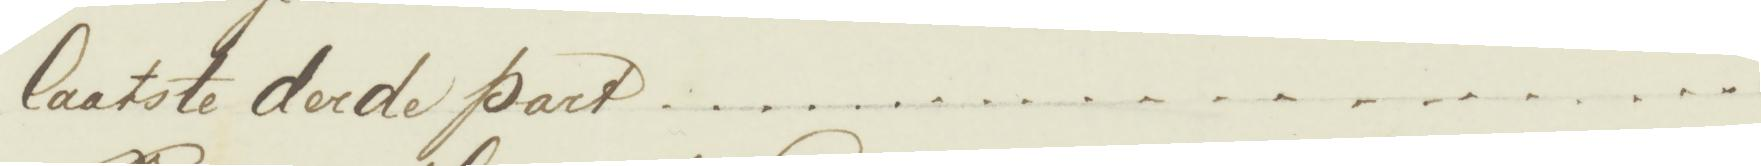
laatste derde part . . . . . . . . . . . . . . . . . . . . .
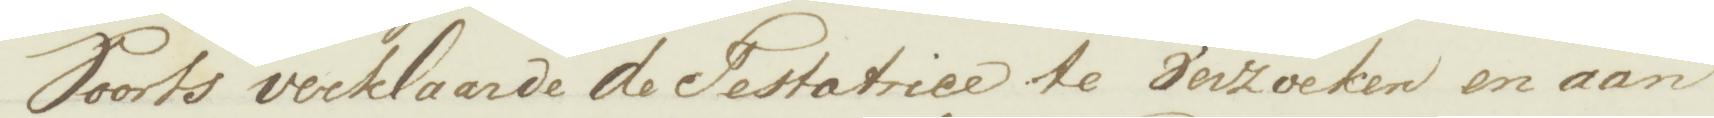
Voorts verklaarde de Testatrice te verzoeken en aan
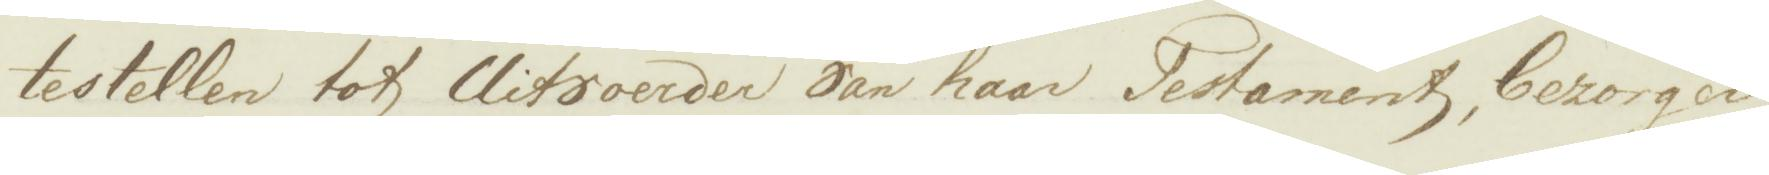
testellen tot uitvoerder van haar Testament, bezorger
